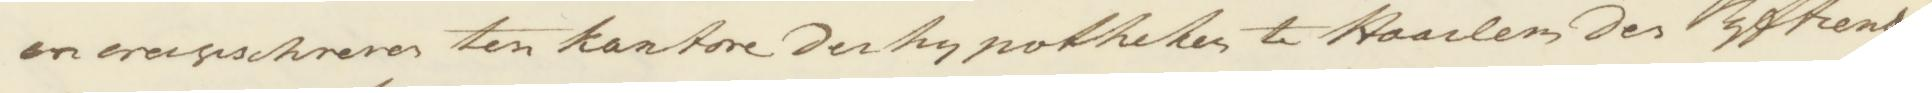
en overgeschreven ten kantore der hypotheken te Haarlem den Vyftienden
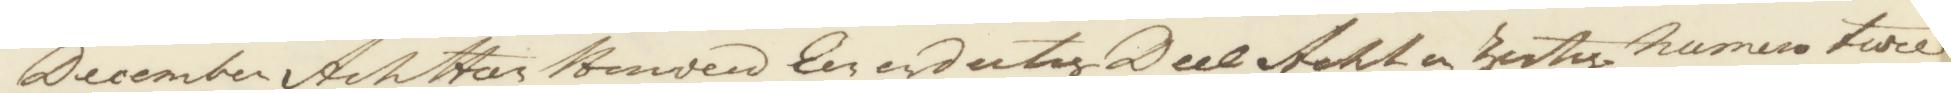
December Achttien Honderd Een en dertig Deel Acht en zestig numero twee
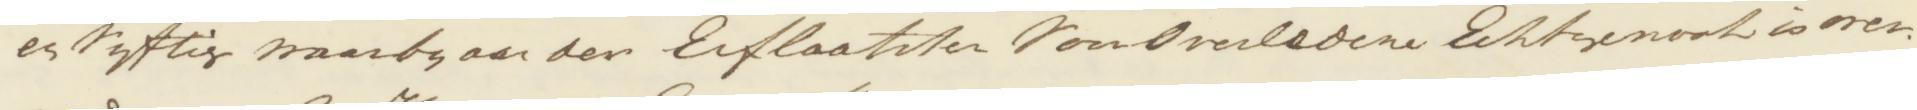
en vijftig waarby aan der Erflaatster vooroverledene Echtgenoot is over.
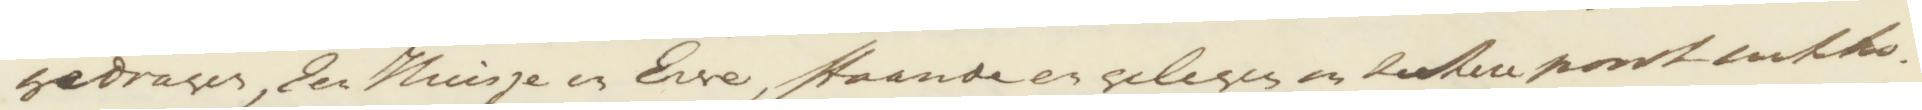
gedragen, Een Huisje en Erve, staande en gelegen in zekere poort uitko.
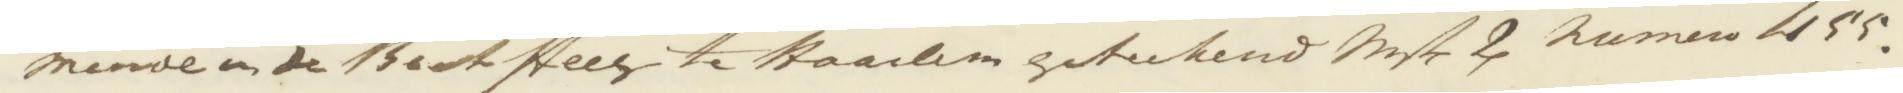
mende in de Beeksteeg te Haarlem geteekend Wyk 2 numero 455.
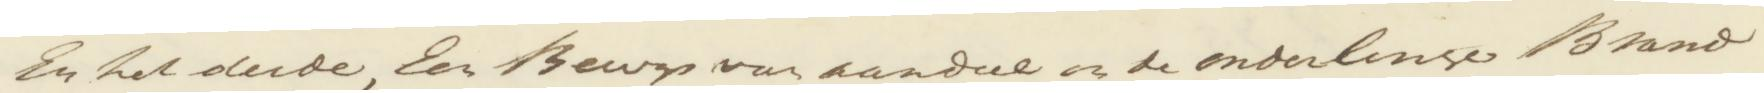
En het derde, Een Bewys van aandeel in de onderlinge Brand
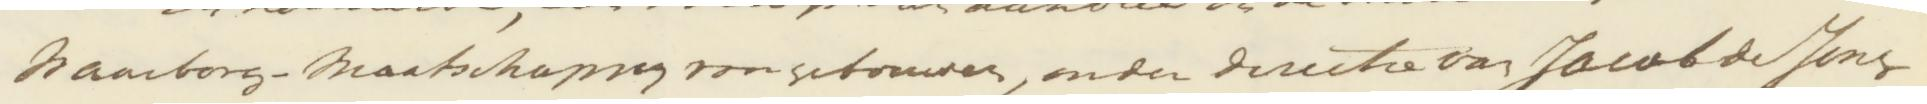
Waarborg-Maatschappy voor gebouwen, onder directie van Jacob de Jong
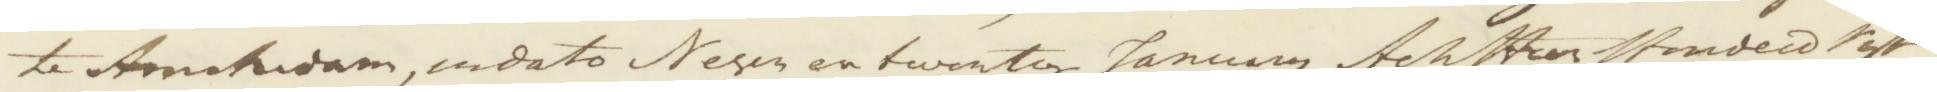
te Amsterdam, in dato Negen en twintig January Achttien Honderd Vyf
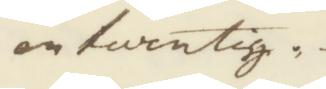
en twintig.
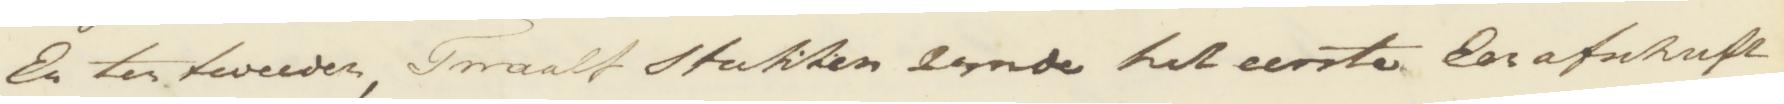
En ten tweeden, Twaalf stukken zynde het eerste Een afschrift
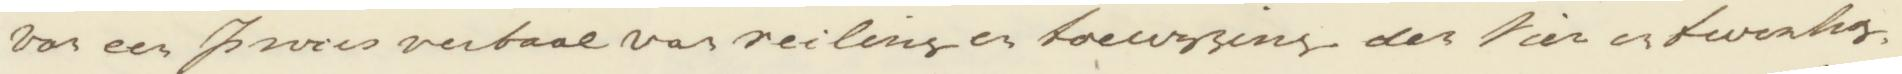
van een proces verbaal van veiling en toewyzing den Vier en twintig,
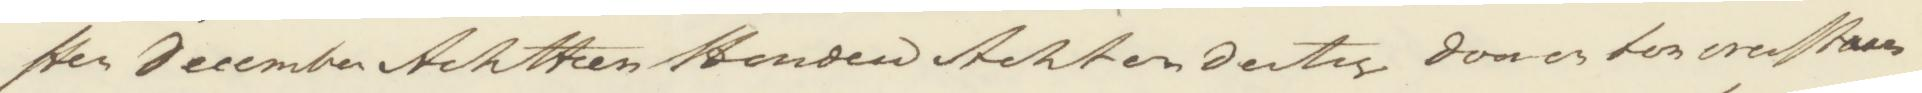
sten december Achttien Houderd Acht en dertig door en ten overstaan
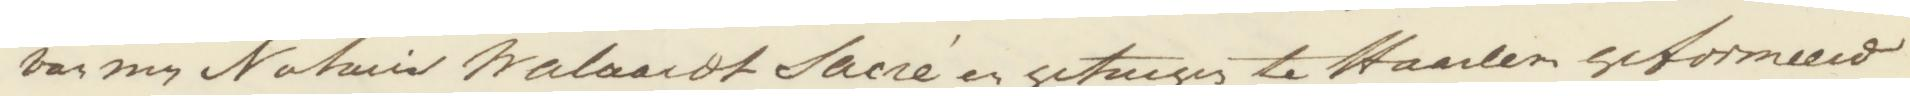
van mj Notaris Walaardt Sacré en getuigen te Haarlem geformeerd
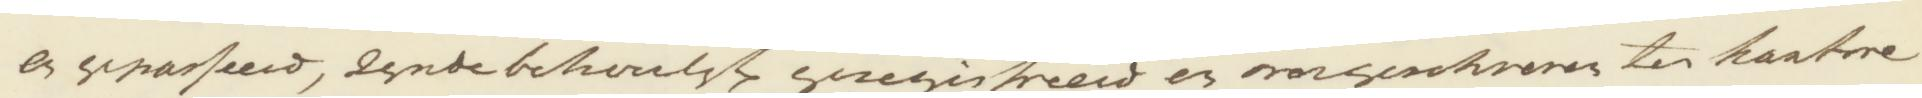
en gepasseerd, zynde behoorlyk geregistreerd en overgeschreven ten kantore
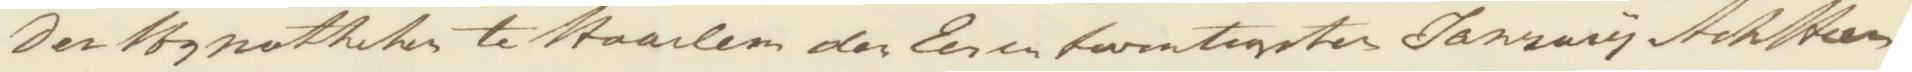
der Hypotheken te Haarlem den Een en twintigsten Ianuarij Achttien
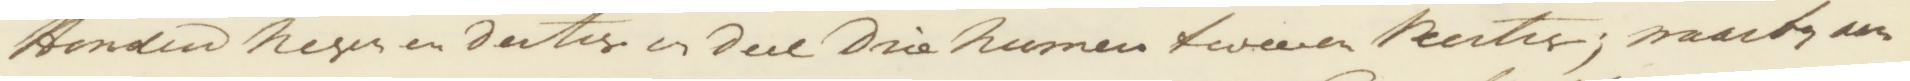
Honderd negen en dertig in deel drie nummer twee en Veertig; waarby aan
